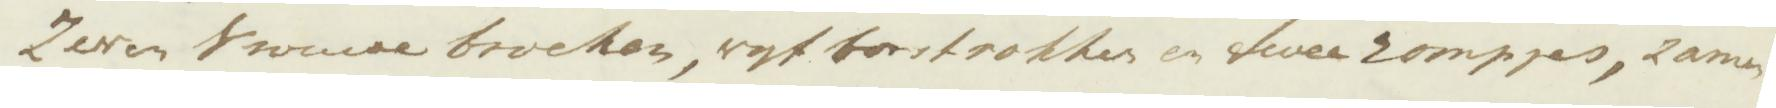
Zeven Vrouwe broeken, vyf borstrokken en twee rompjes, zamen
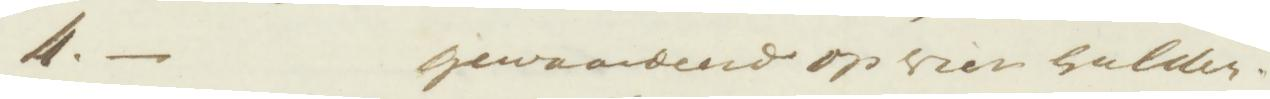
4. — gewaardeerd op vier Gulden
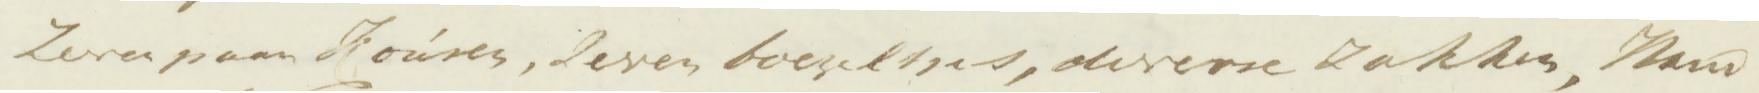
Zeven paar kousen, zeven boezeltjes, diverse zakken, hand
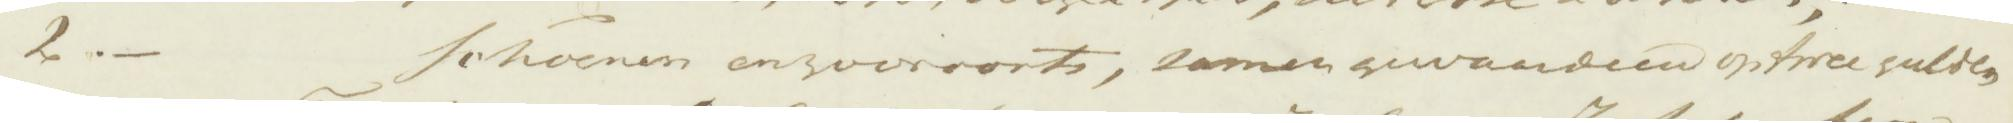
2. — schoenen enzoovoorts, zamen gewaardeerd op twee gulden
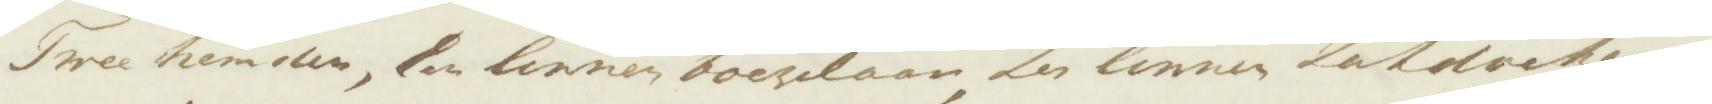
Twee hemden, Een linnen boezelaar, zes linnen zakdoeken,
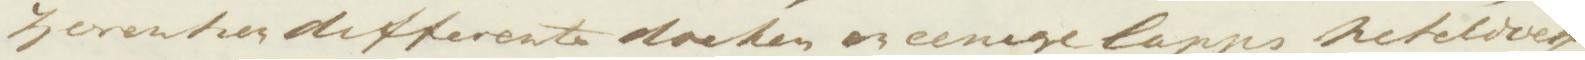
zeventien differente doeken en eenige lapps neteldoek
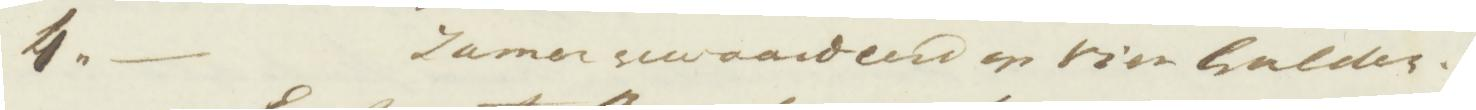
4„ — zamen gewaardeerd op vier Gulden.
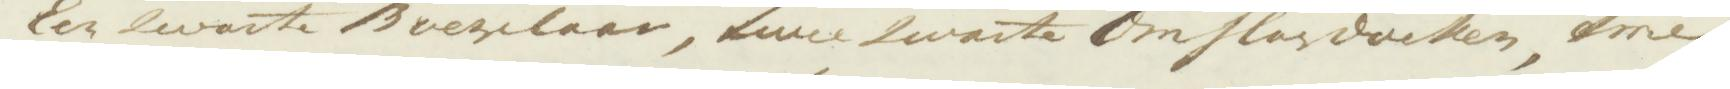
Een zwarte Boezelaar, twee zwarte Omslagdoeken, twee
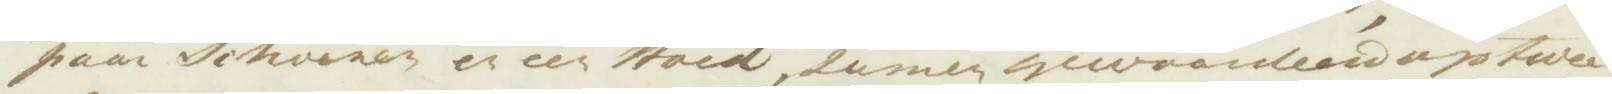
paar schoenen en een hoed, zamen gewaardeerd op twee
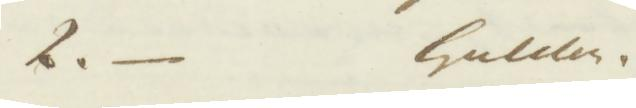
2. — Gulden.
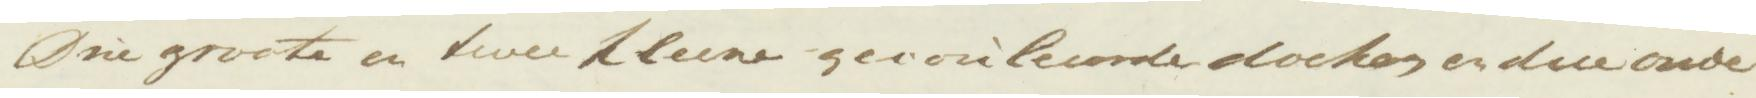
Drie groote en twee kleere gecouleurde doeken en drie oude
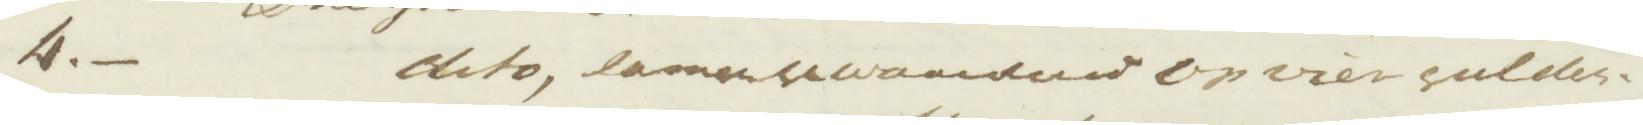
4. — dito, zamen gewaardeerd op vier gulden.
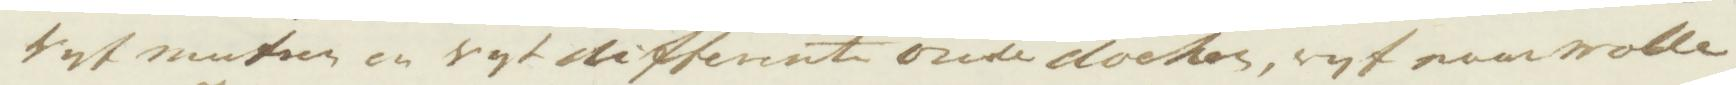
vyf mutsen en vyf differente oude doeken, vyf paar wolle
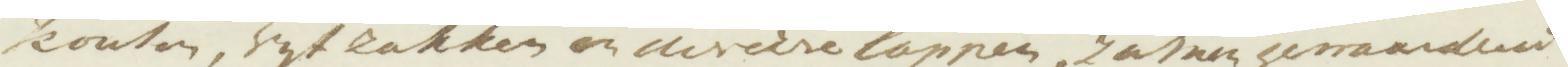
kousen, vyf zakken en diverse lappen, zamen gewaardeerd
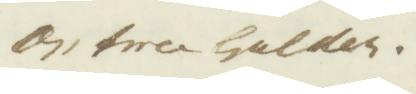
Op twee Gulden.
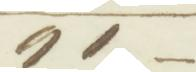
91. —
